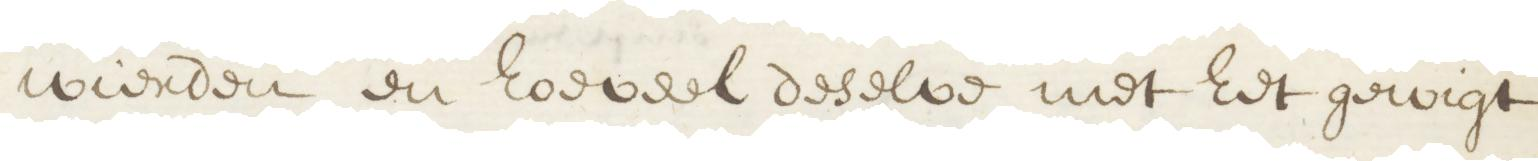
wierden, en hoeveel deselve met het gewigt
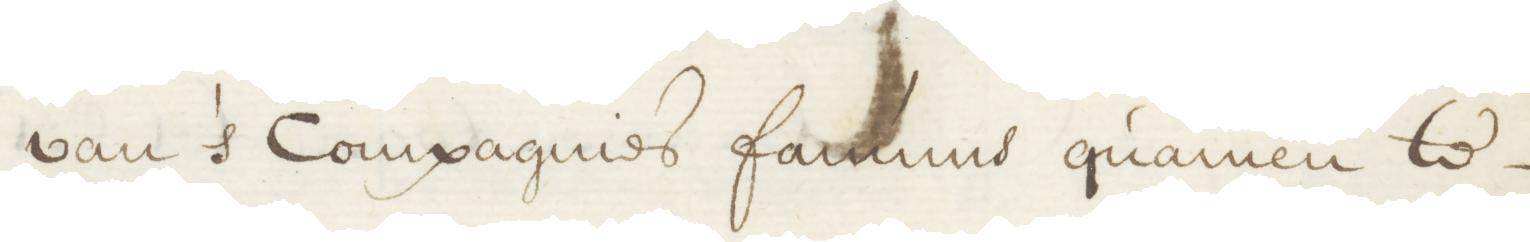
van ’s Compagnies fanums quamen te
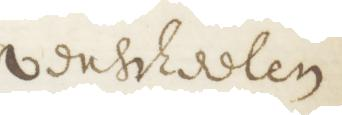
verscheelen
